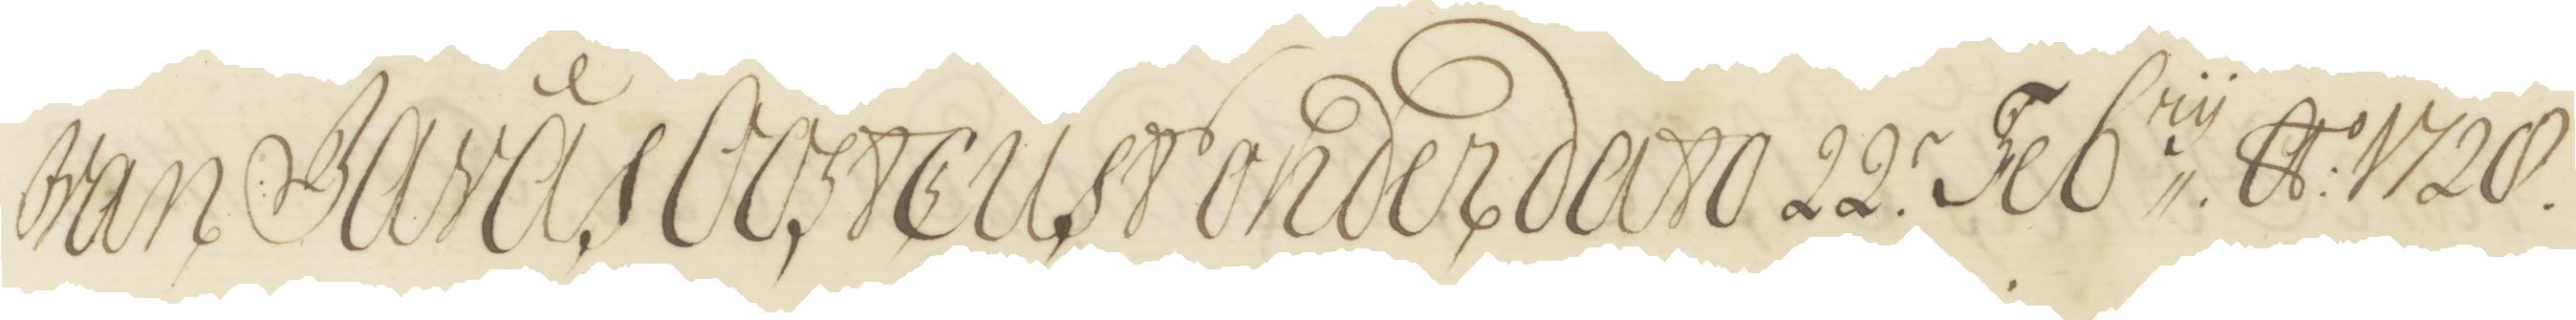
Van Javâs Oost cust onder dato 22:' Feb„rij. A:o 1728.
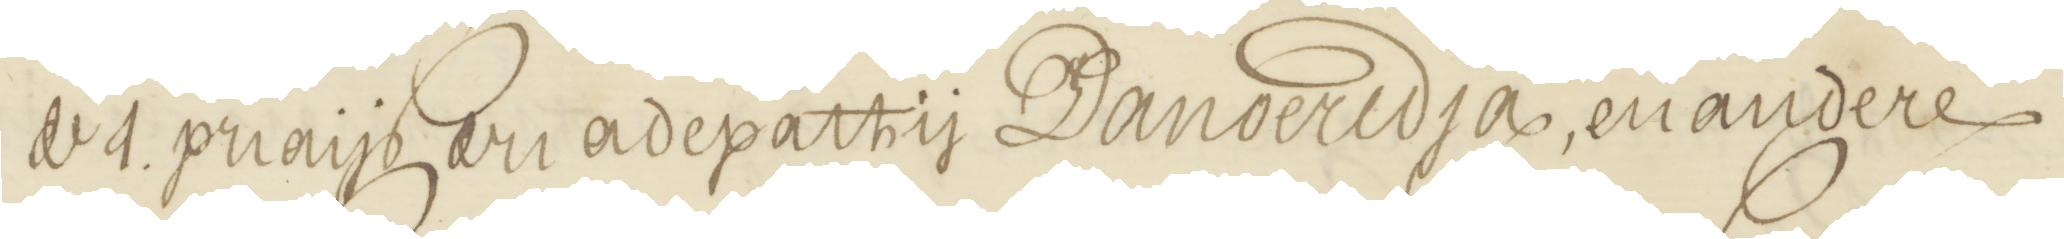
de 4. priaijs den adepattij Danoeredja, en andere
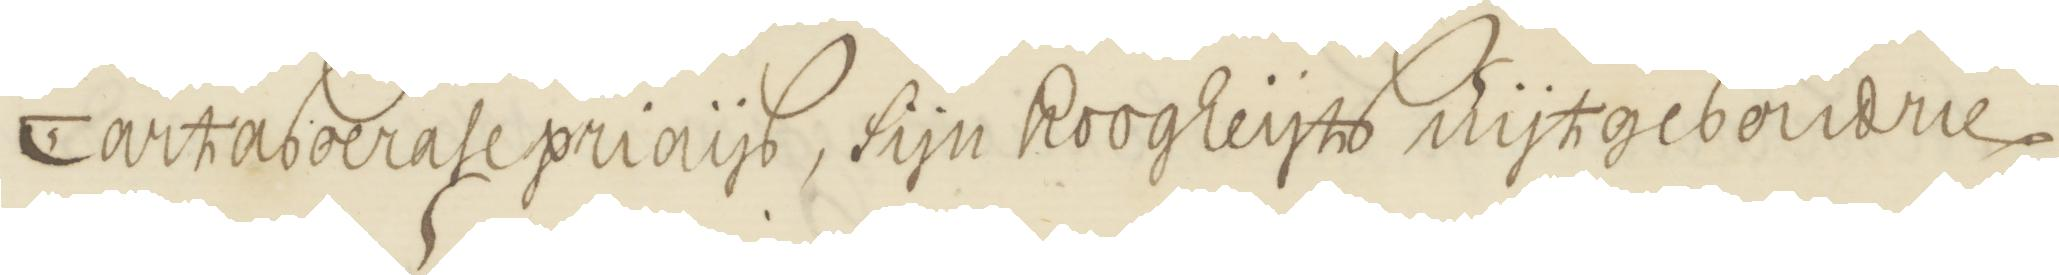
cartasoerase priaijs, sijn hoogheijts uijtgesondene
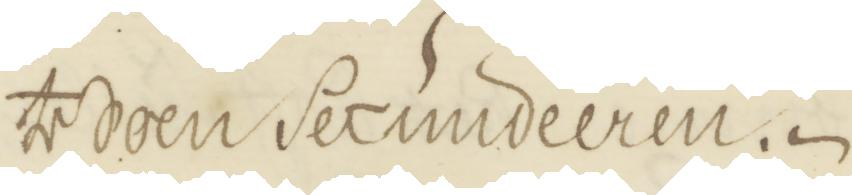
te doen secundeeren. —
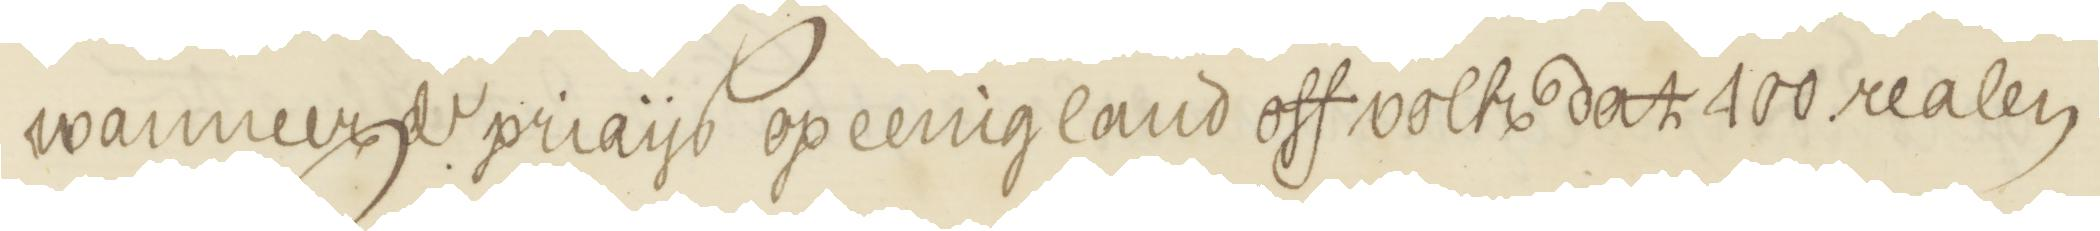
wanneer de priaijs op eenig land off volk dat 400. realen
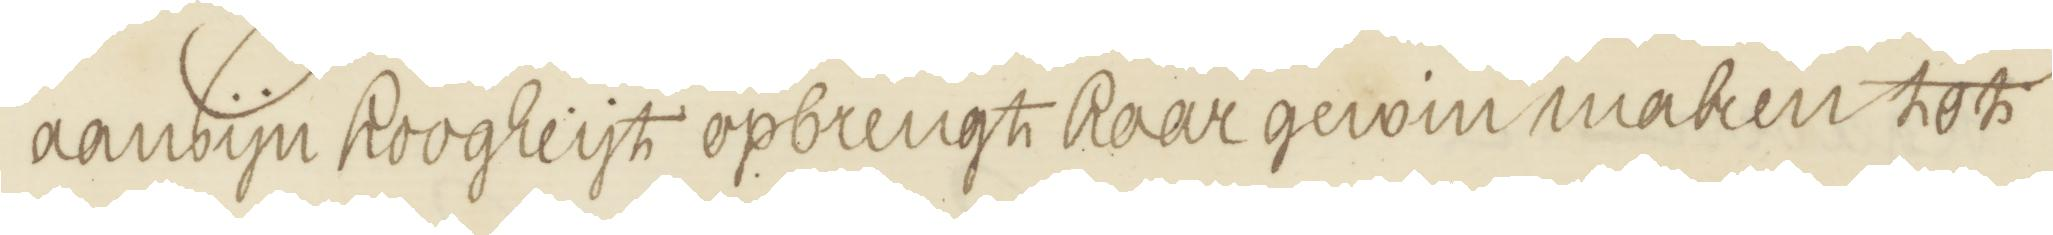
aan sijn hoogheijt opbrengt haar gewin maken tot
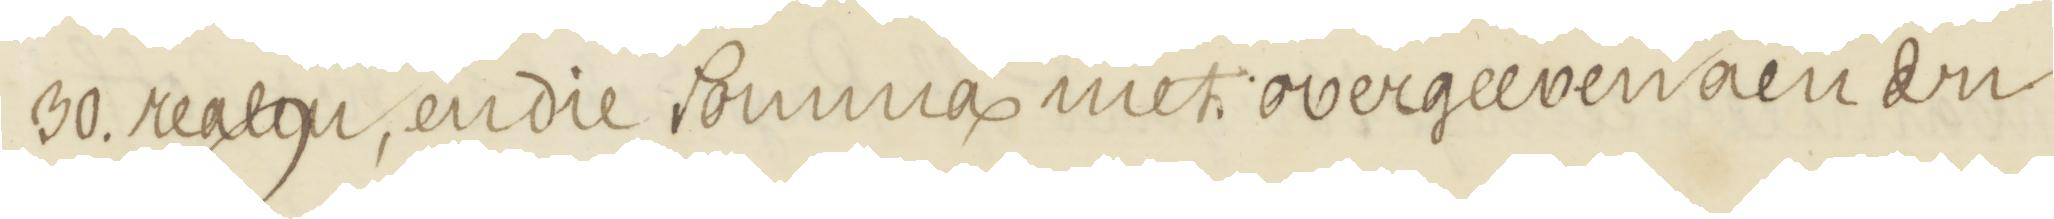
30. realen, en die somma niet overgeeven aen den
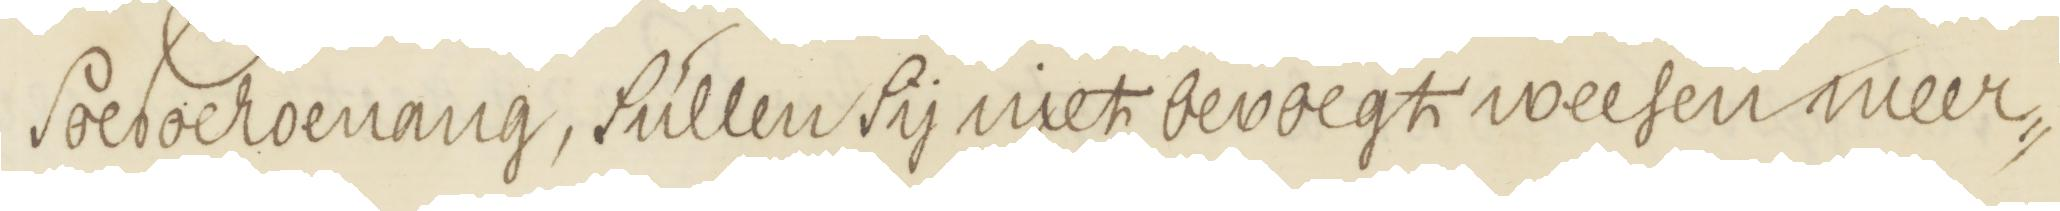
soesoehoenang, sullen sij niet bevoegt weesen meer„
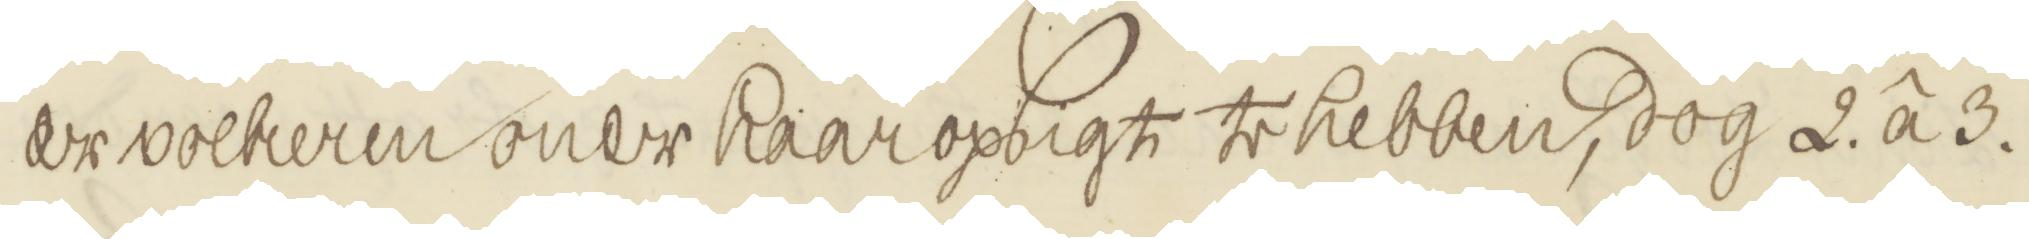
der volkeren onder haar opsigt te hebben, dog 2. â 3.
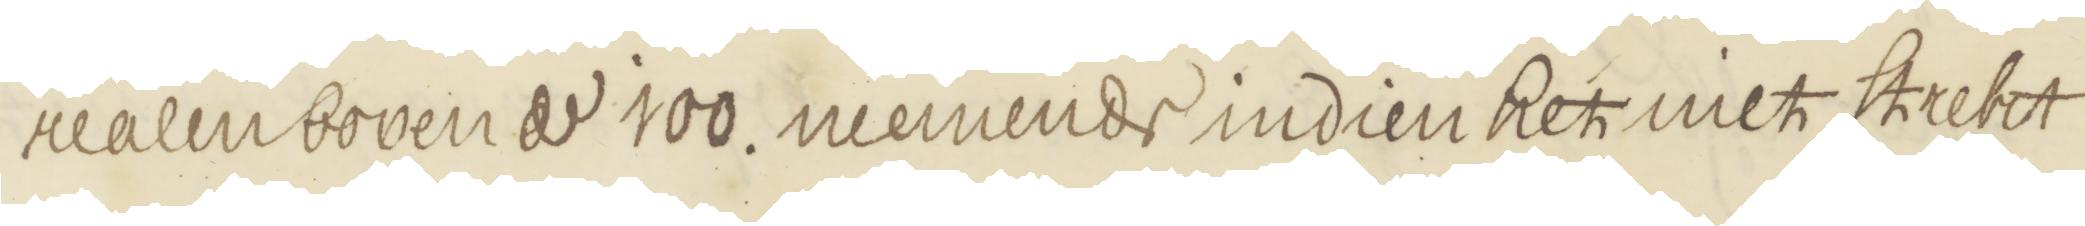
realen boven de 100. neemende indien het niet strekt
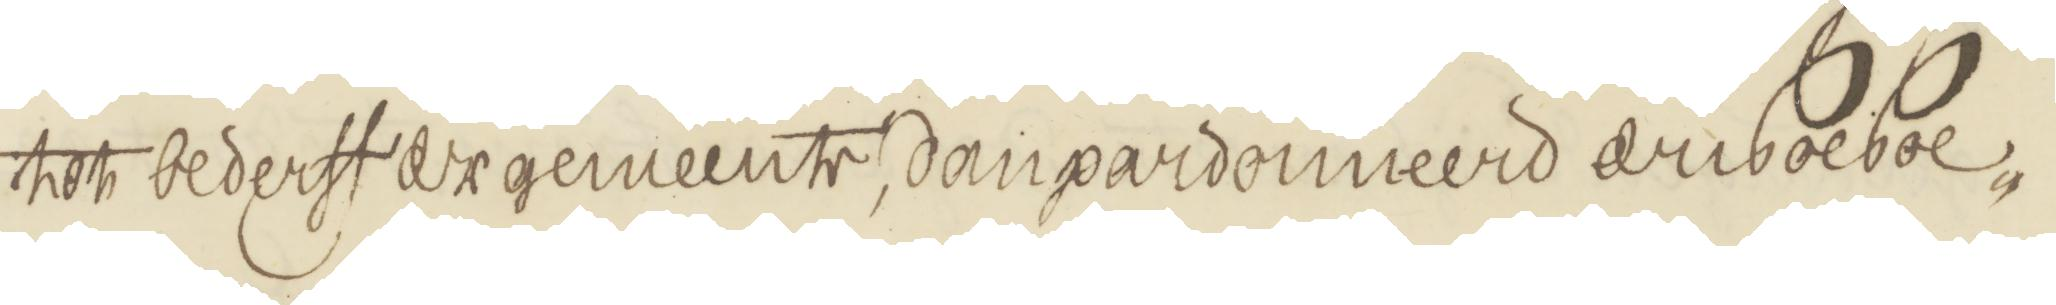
tot bederff der gemeente, dan pardonneerd den soesoe„
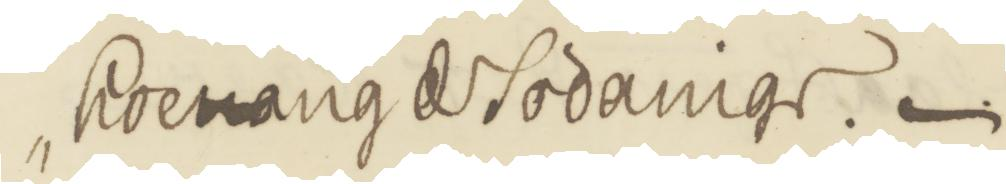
„hoenang de sodanige. —.
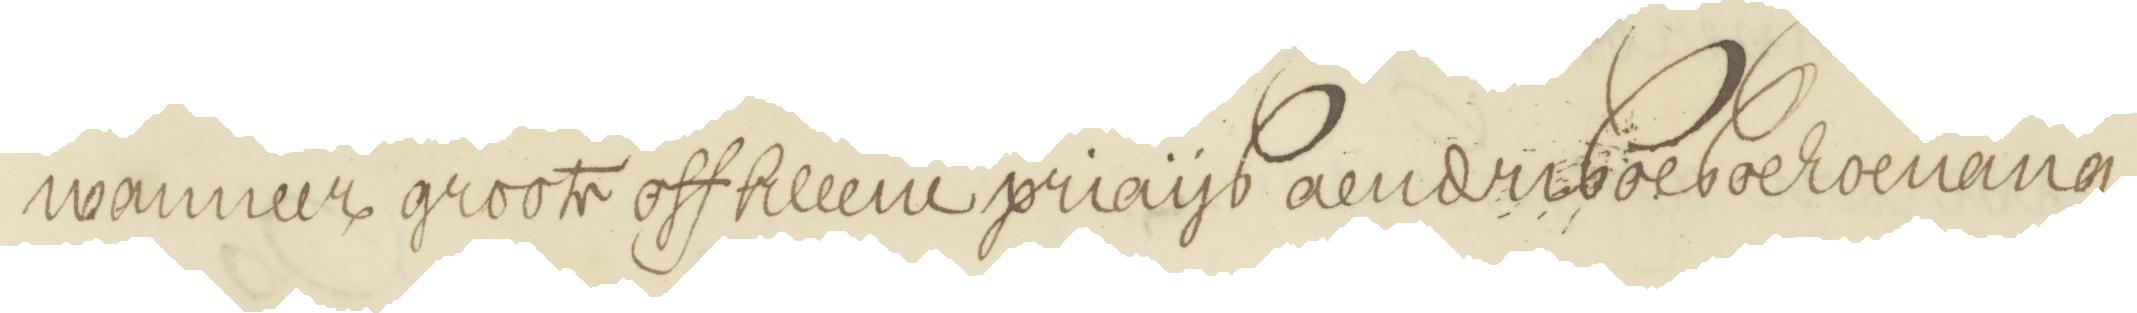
wanneer groote off kleene priaijs aen den soesoehoenang
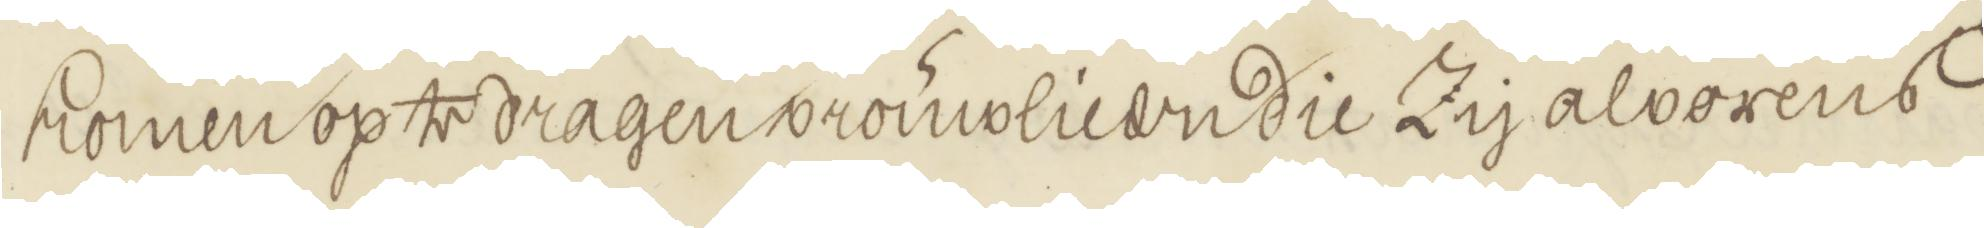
komen op te dragen vrouwlieden die zij alvorens
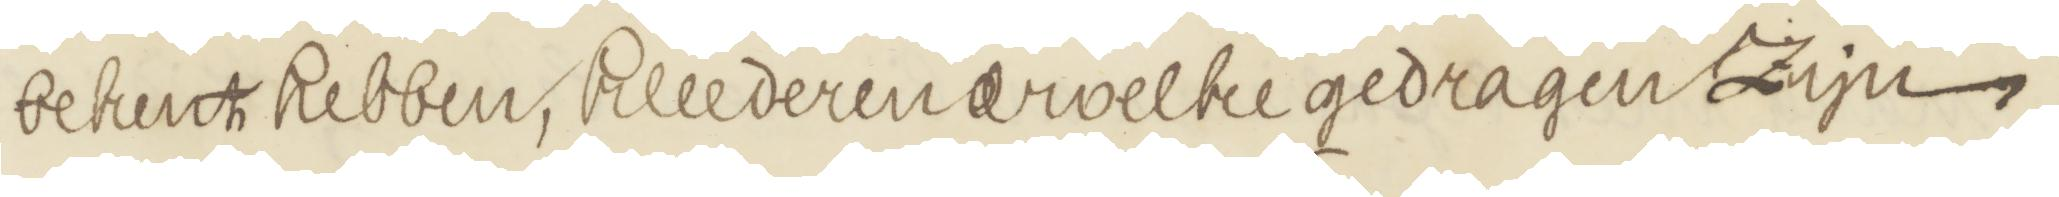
bekent hebben, kleederen dewelke gedragen zijn,
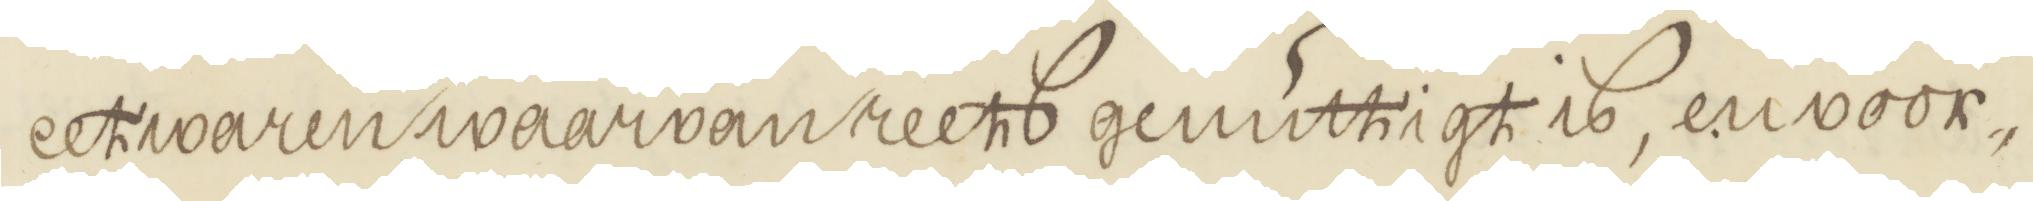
eetwaren waarvan reets genuttigt is, en voor„
